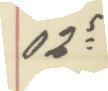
02=5
